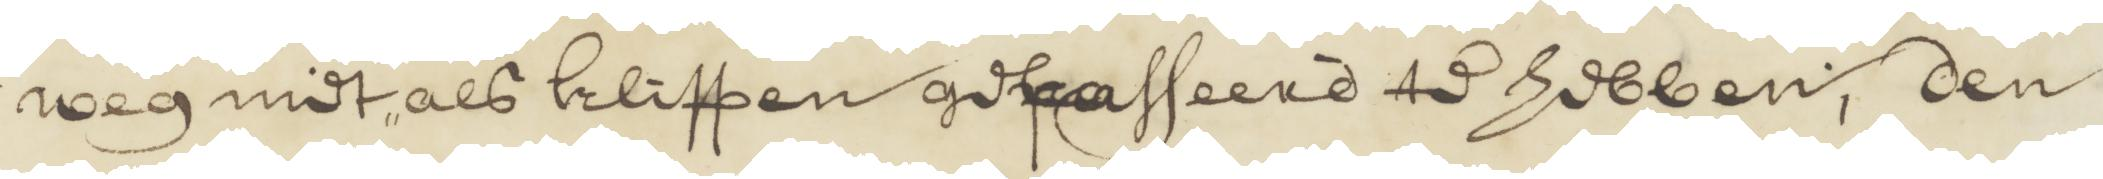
weg niet „ als klippen gepasseerd te hebben, den
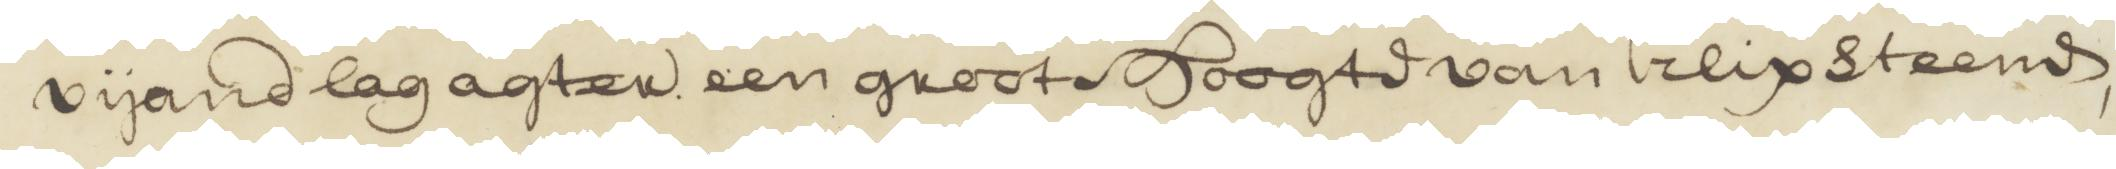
vijand lag agter een groot Hoogte van klipsteenen,
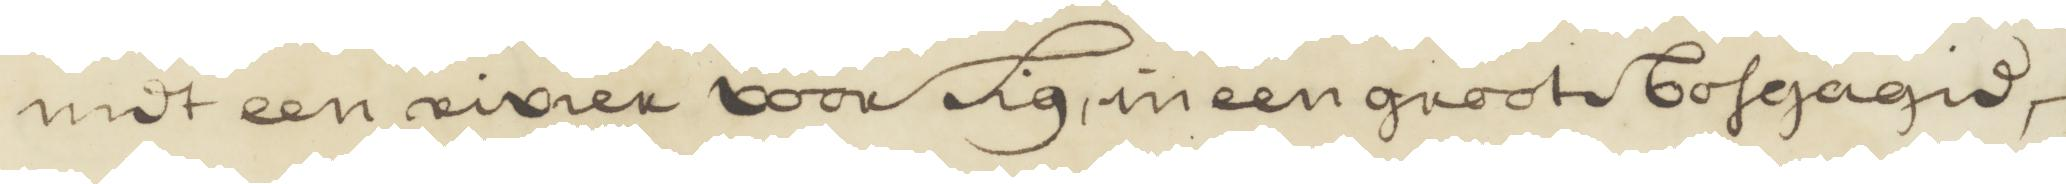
met een rivier voor Sig, in een groote bosgagie,
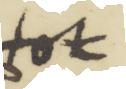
tot
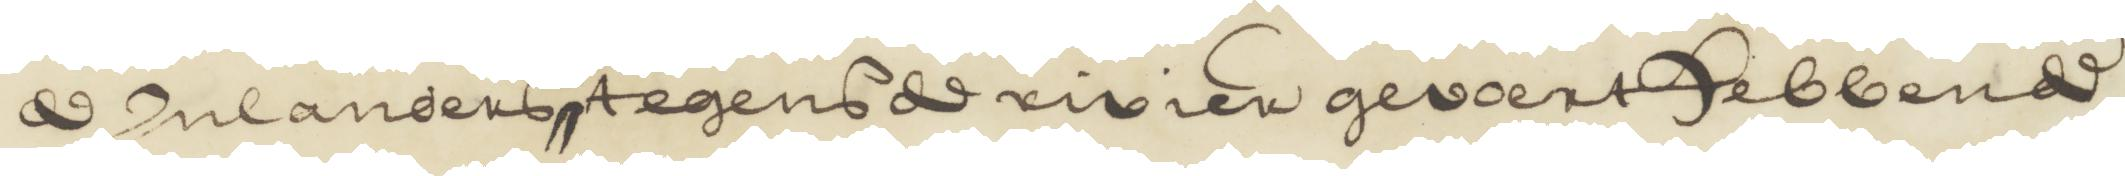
de Jnlanders „ tegens de rivier gevoert Hebbende
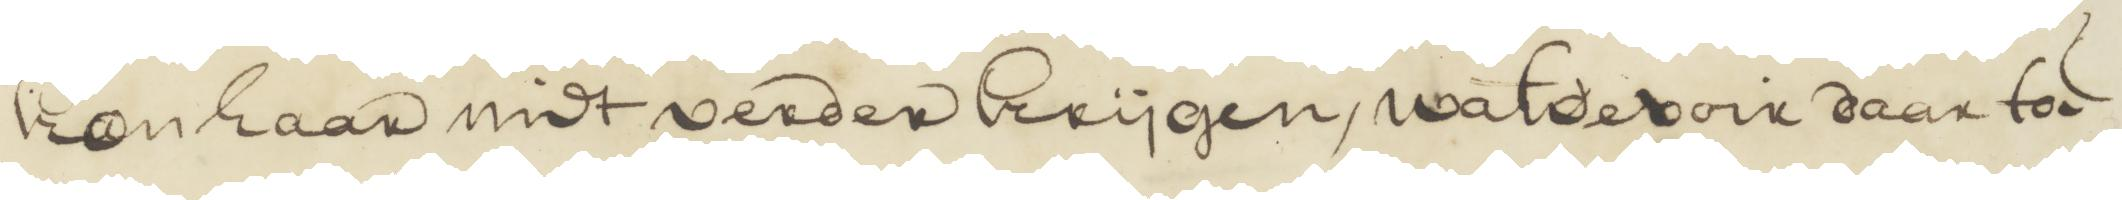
kon haar niet verder krijgen, wat devoir daar toe
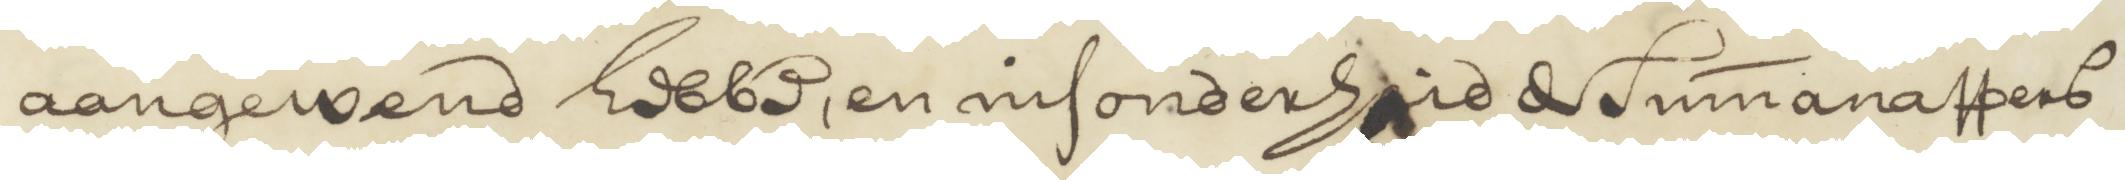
aangewend hebbe, en insonderheid de Sumanappers
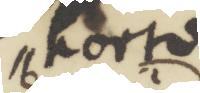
„ korte
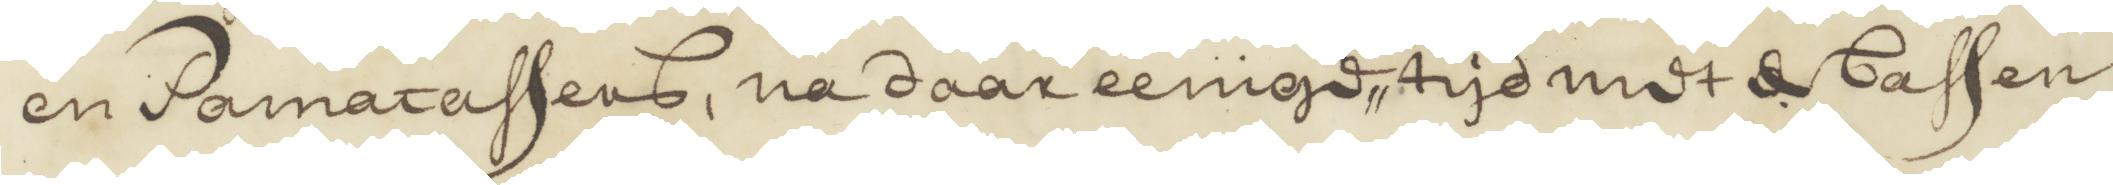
en Pamacassers, na daar eenige „ tijd met de bassen
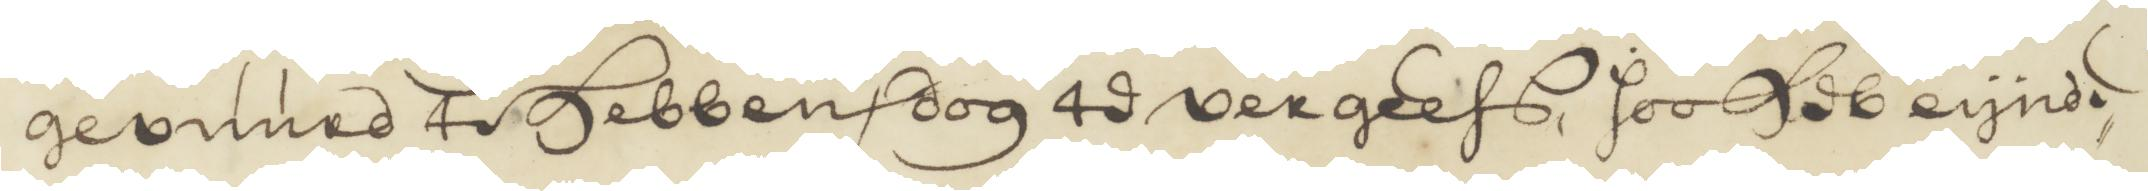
gevuurd te Hebben, dog te vergeefs, soo heb eijnde„
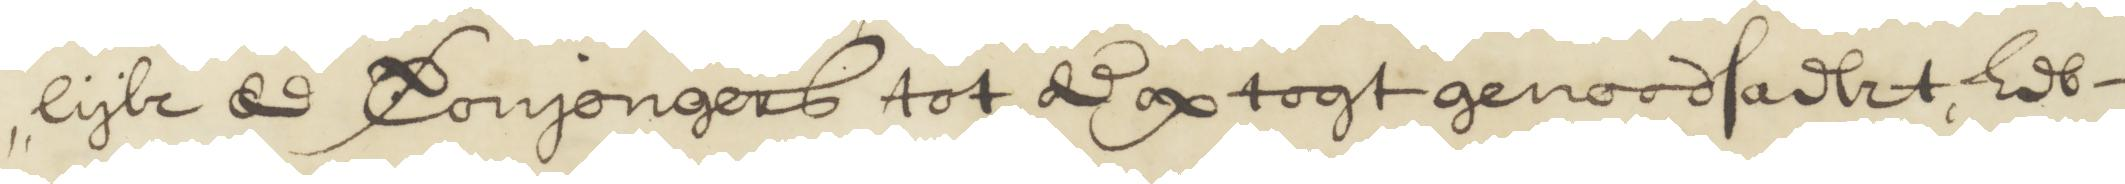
„lijk de Tonjongers tot de op togt genoodsaekt, heb —
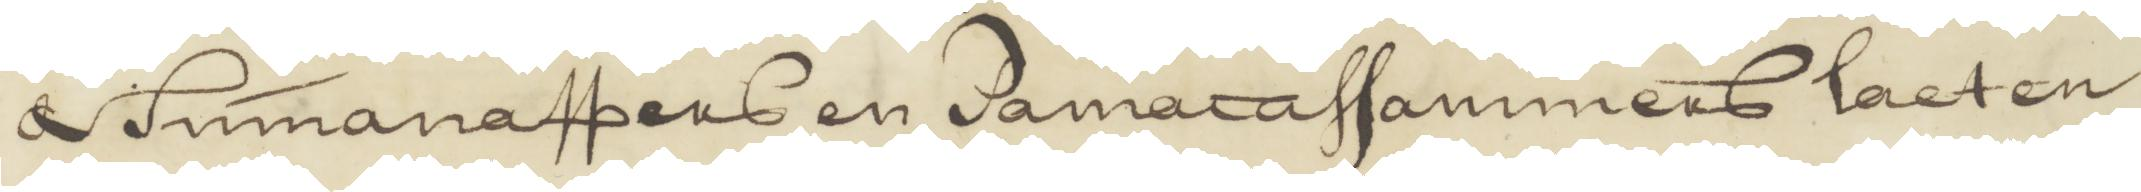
de Sumanappers en Pamacassammers laeten
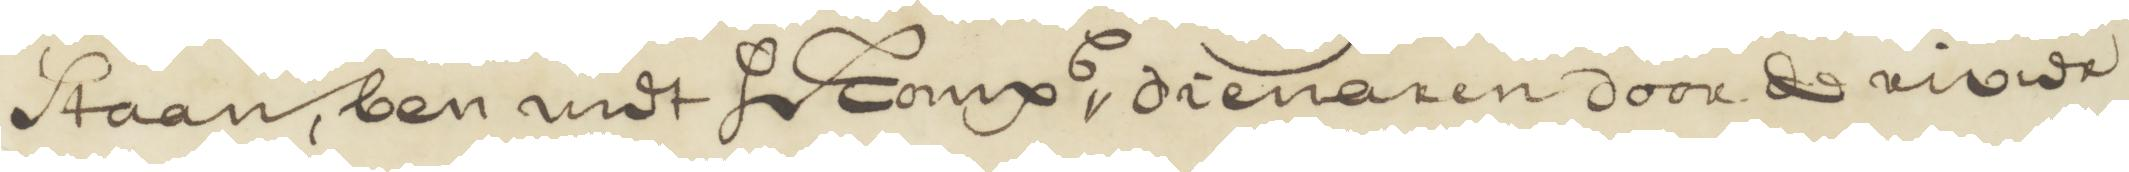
staan, ben met SE comp„s dienaren door de rivier
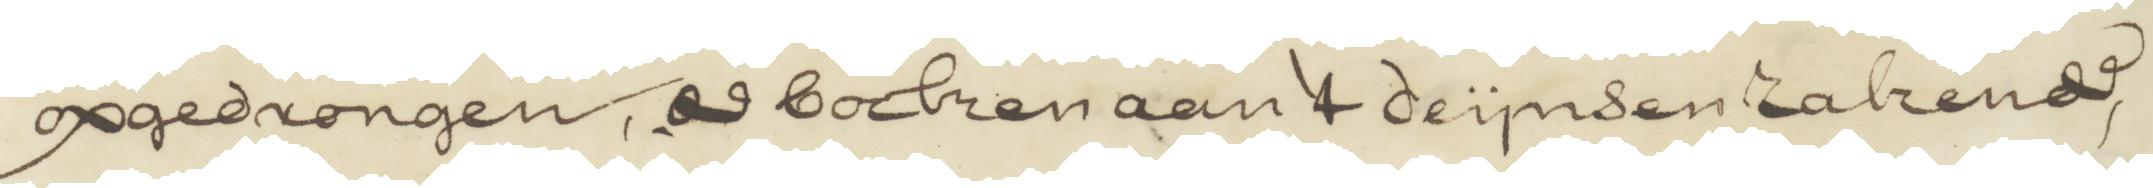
opgedrongen, de bocken aan ’t deijnsen rakende,
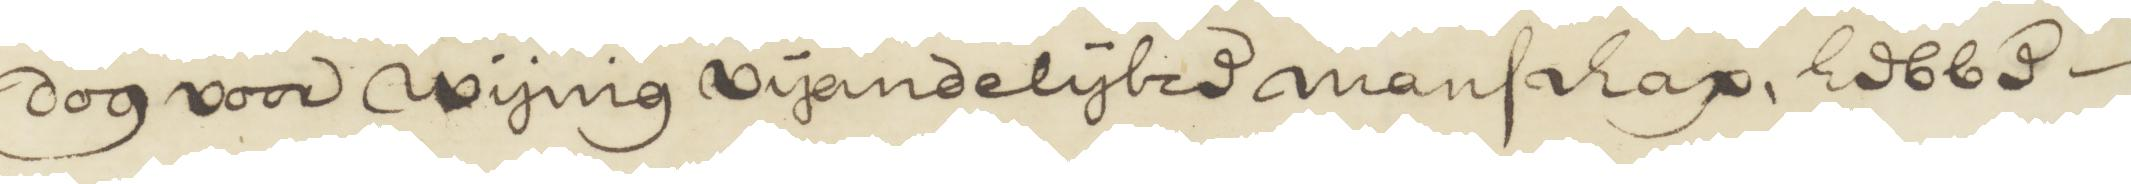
dog voor wijnig vijandelijke manschap, hebbe —
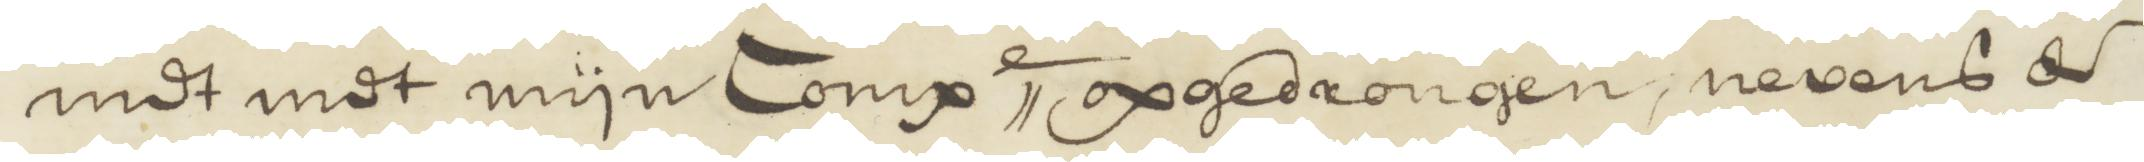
met met mijn Comp„e opgedrongen, nevens de
